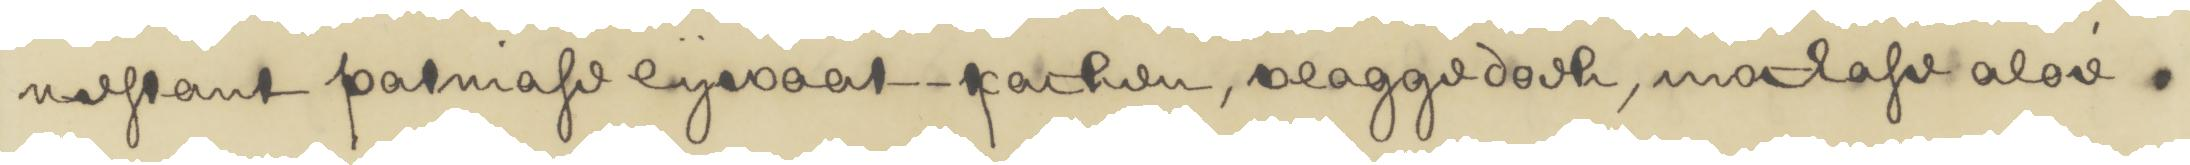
restant patniase lijwaat-packen, vlaggedoek, mochase aloe
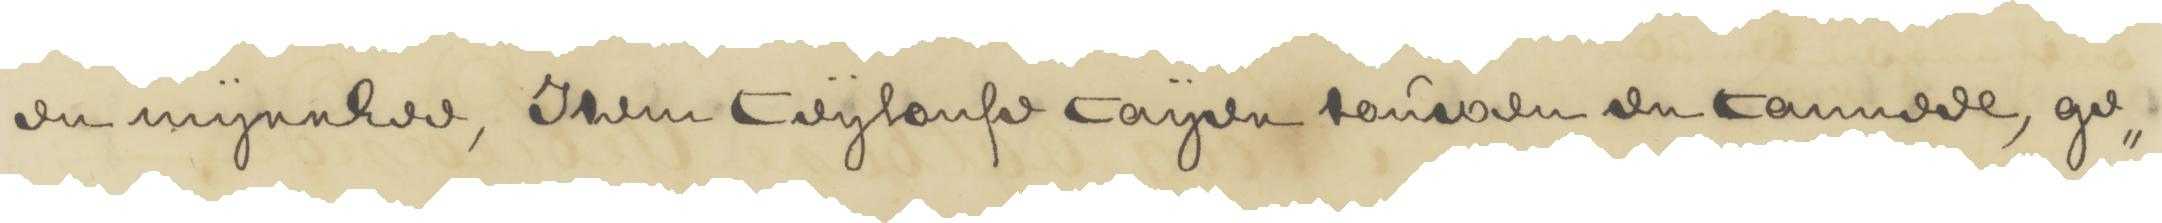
en mijrrhee, Item Ceijlonse caijer touwen en canneel, ge„
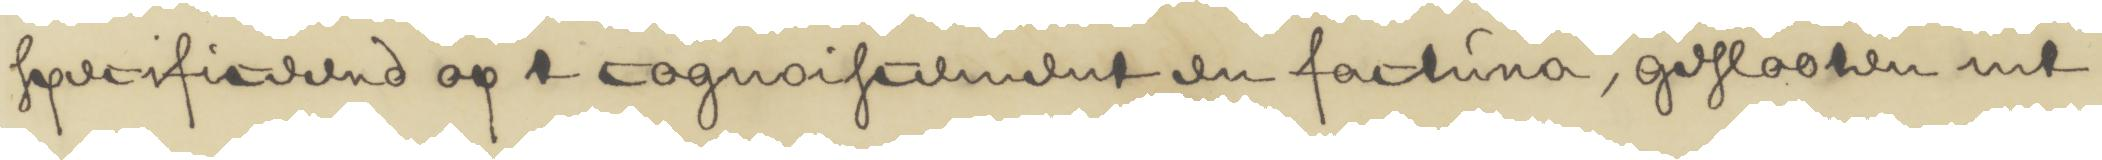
specificeerd op ’t cognoiscement en factura, geslooten in't
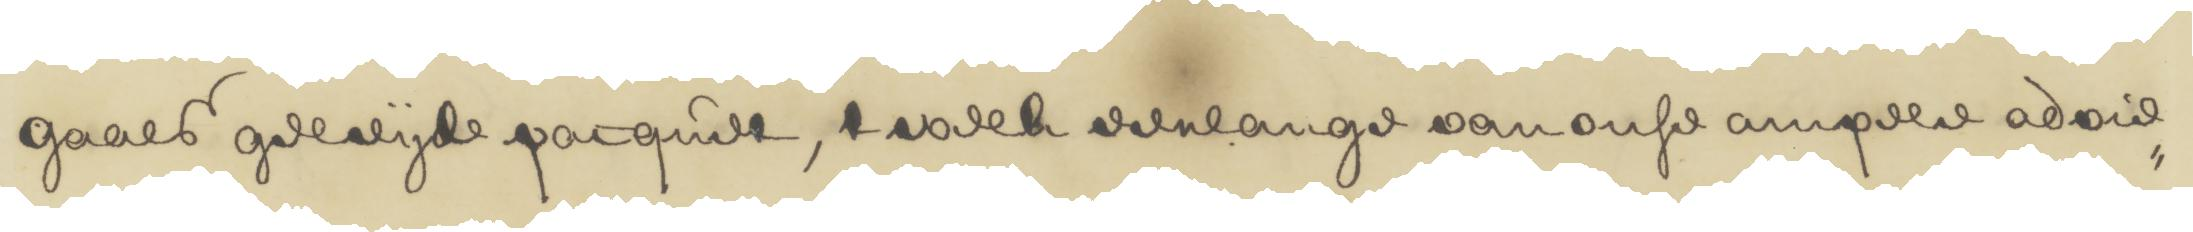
gaals geleijde pacquet, 't welk eerlange van onse ampele advie
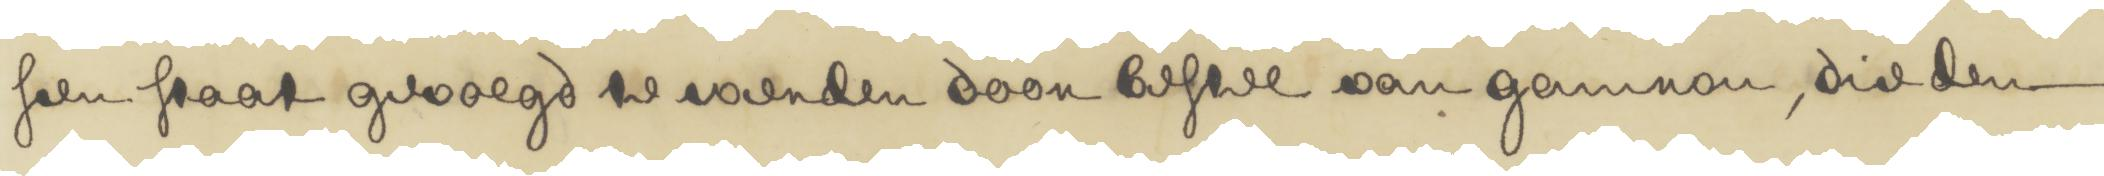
sen staat gevolgd te werden door bestel van gamron, die den
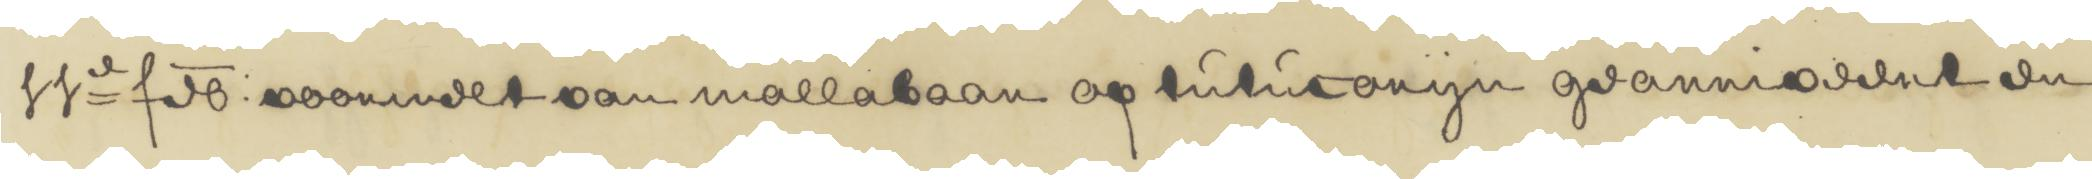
11=e feb: voormelt van mallabaar op tutucorijn gearriveert en
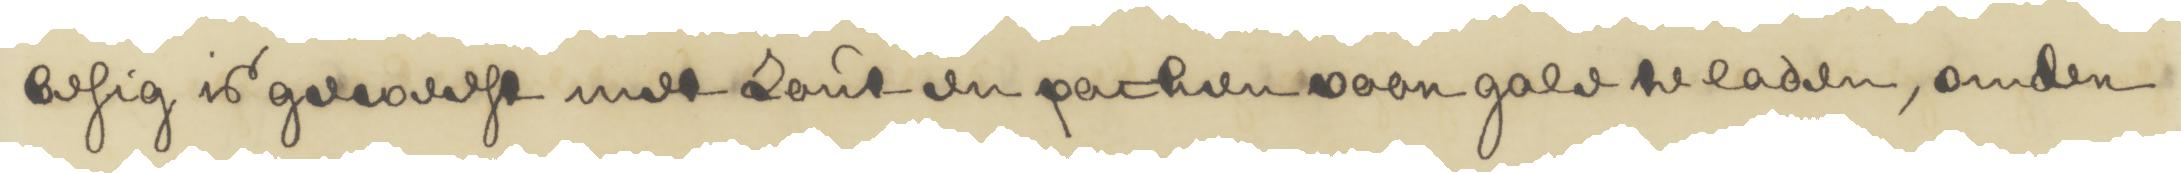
besig is geweest met zout en packen voor gale te laden, om der
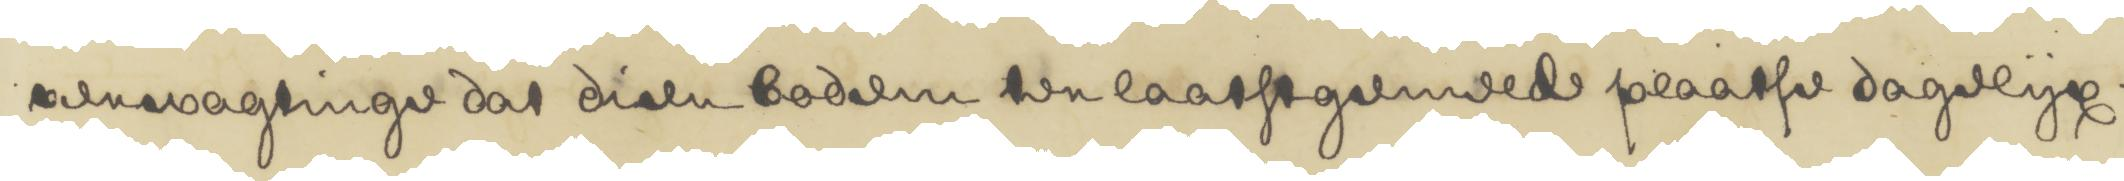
verwagtinge dat dien bodem ter laatst gemelde plaatse dagelijx
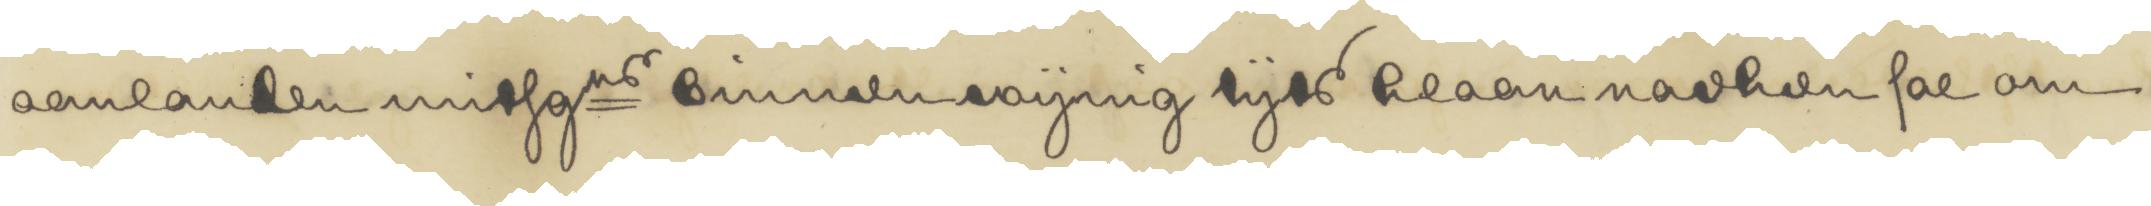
aanlanden mitsg=rs binnen wijnig tijts klaar raeken sal om
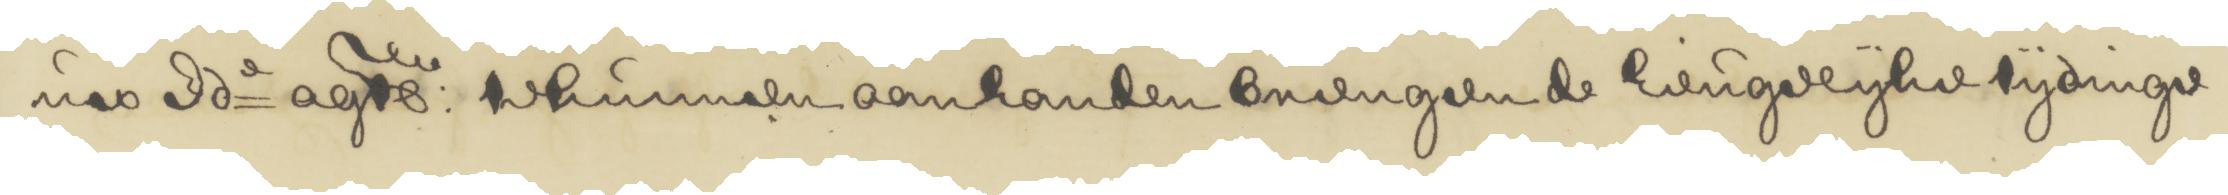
uw Ed=e agtb: te kunnen aanhanden brengen de heugelijke tijdinge
